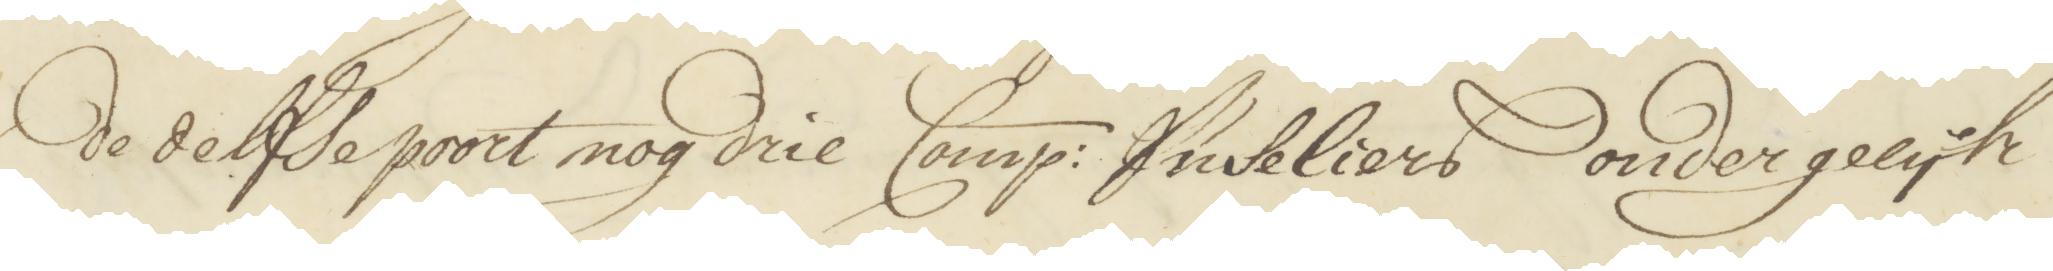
de delfse poort nog drie Comp: Vuseliers onder gelijk
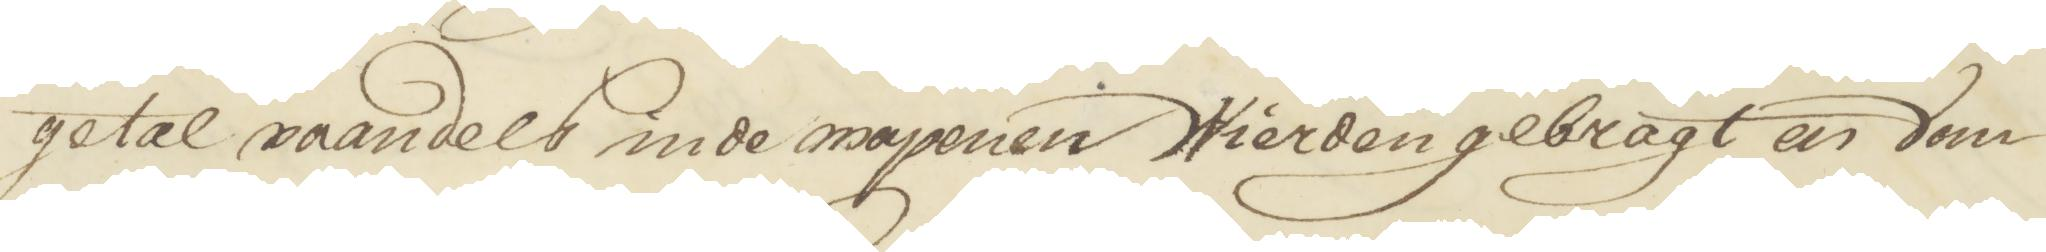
getal vaandels in de wapenen Wierden gebragt en dan
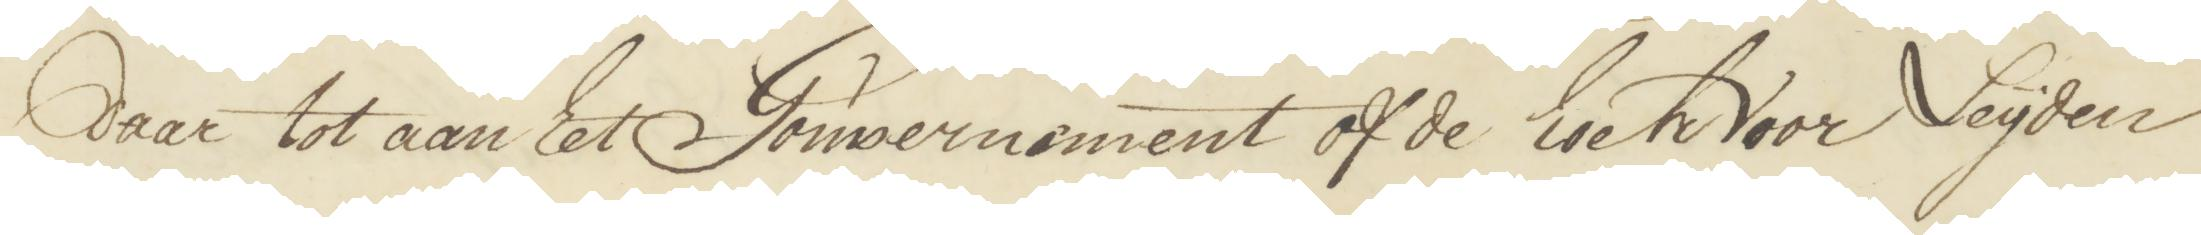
daar tot aan het Gouvernement of de hoek Voor Leijden
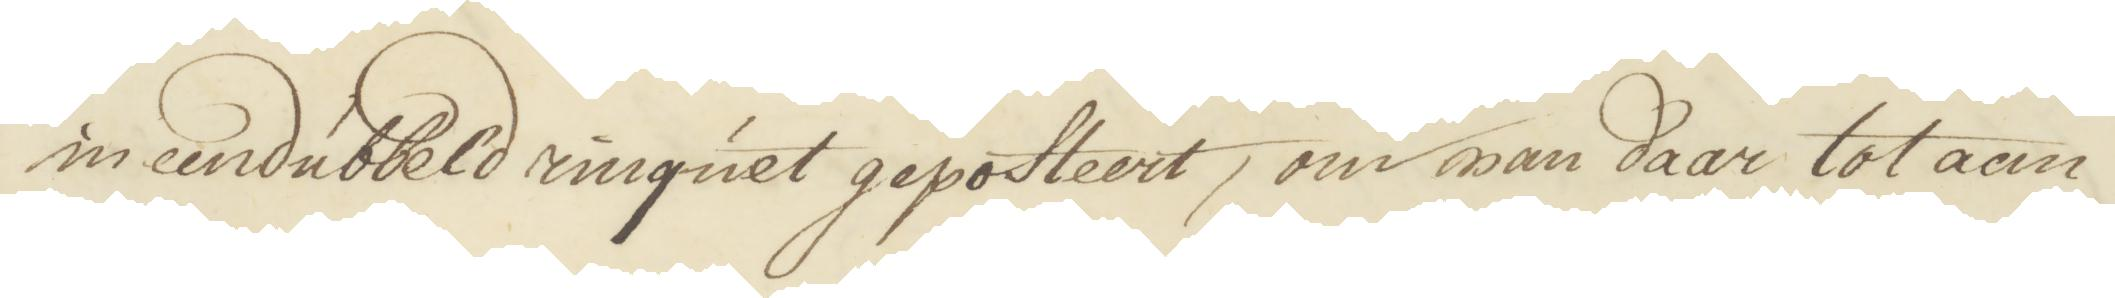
in eendubbeld rinquet geposteert, om van daar tot aan
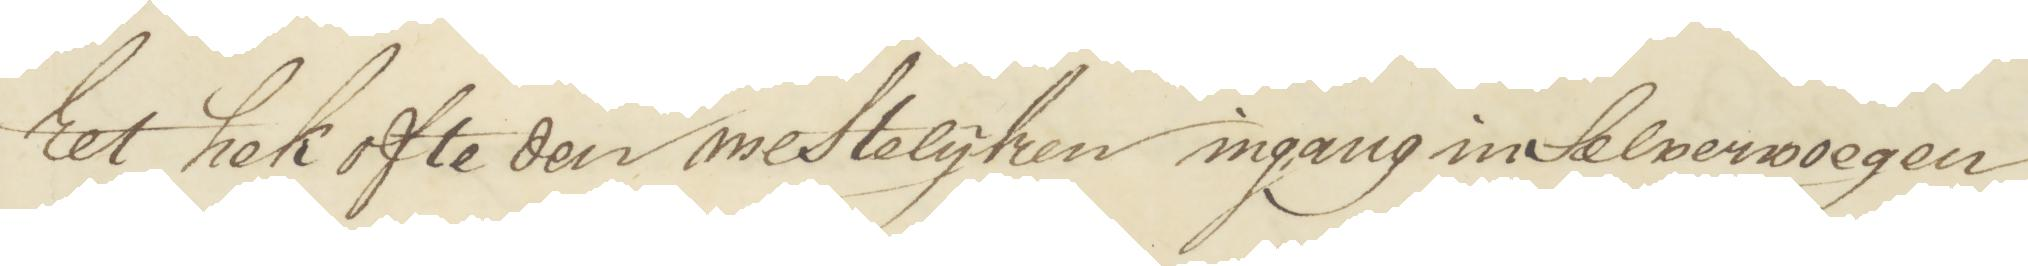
het hek ofte den westelijken ingang in selvervoegen
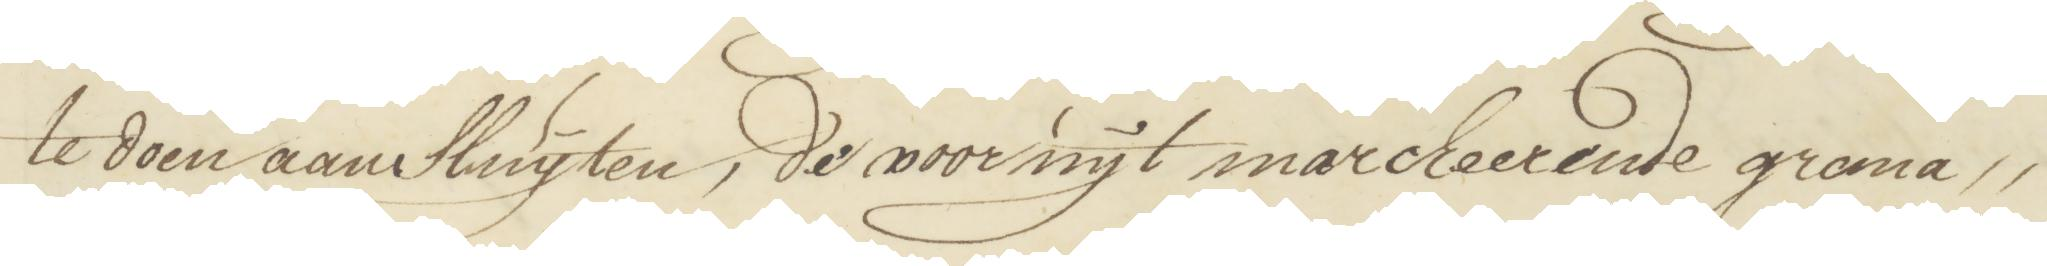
te doen aansluijten, de voor uijt marcheerende grana„
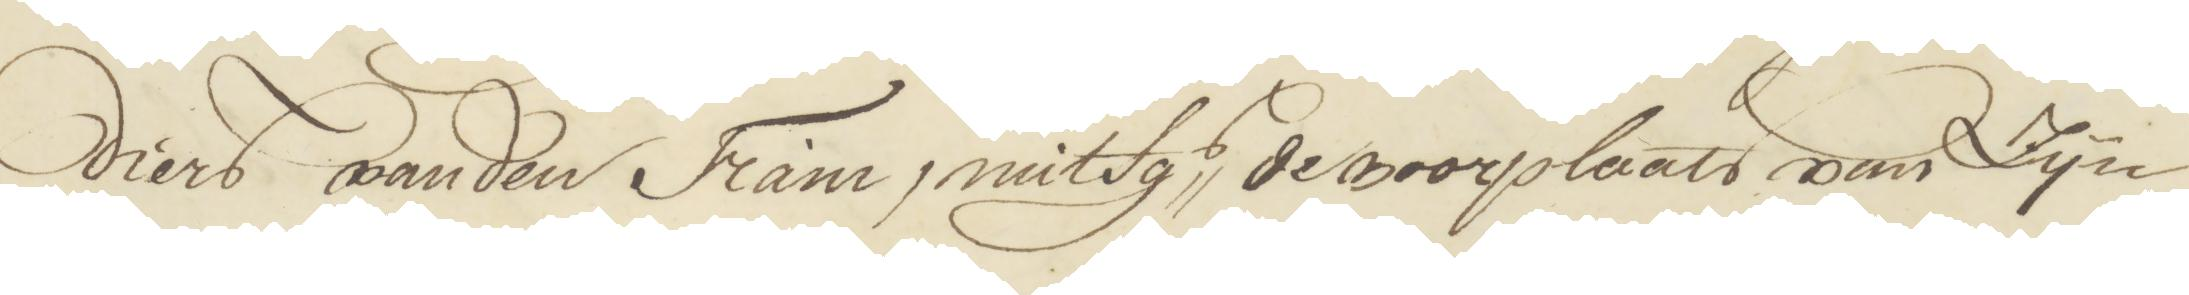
diers van den Tram, mitsg„s de voorplaats van zijn
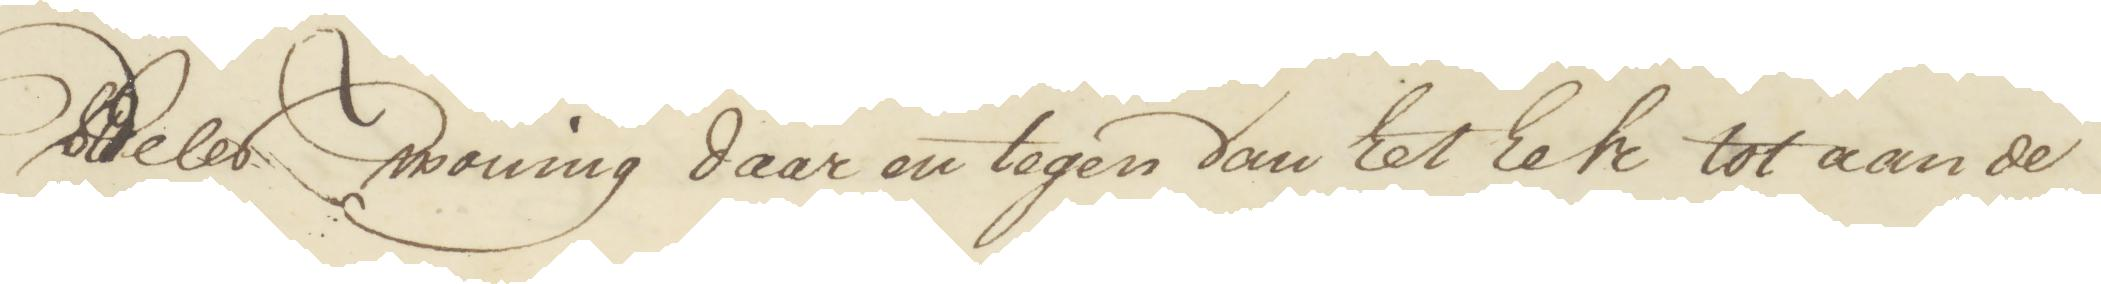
Edeles woning daar en tegen Van het hek tot aan de
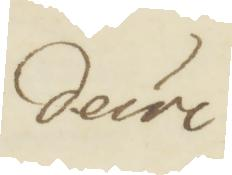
deur
